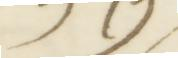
39/
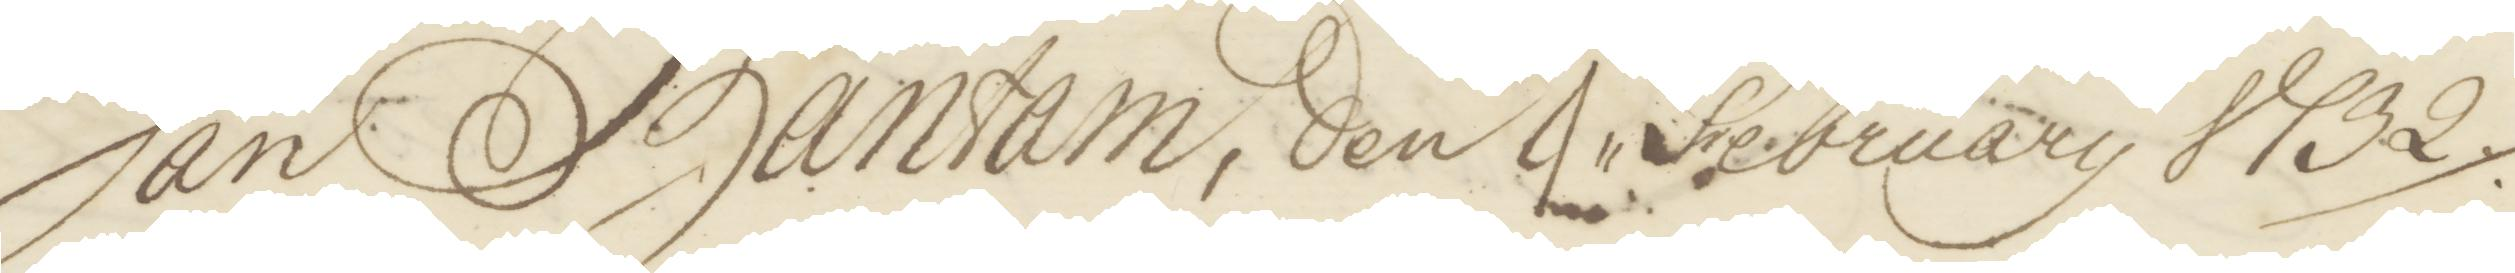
Van Bantam, den 4„e Februarij 1732./.
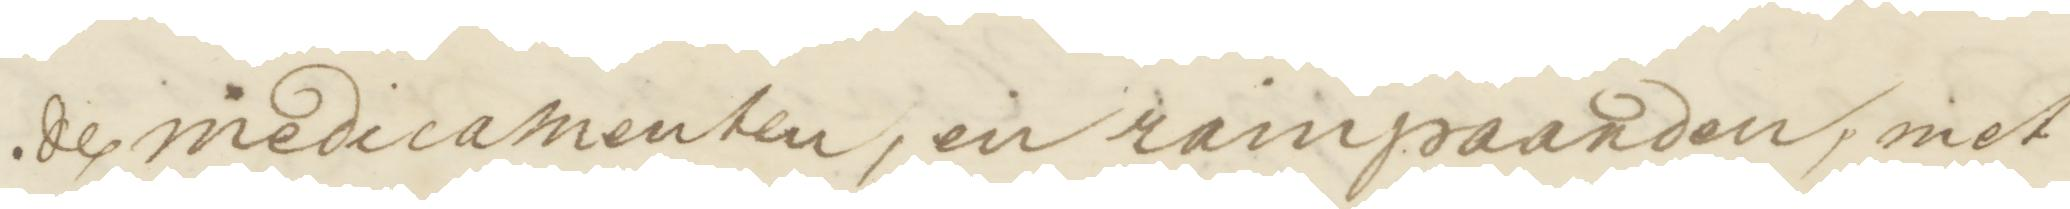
de medicamenten, en rampaarden, met
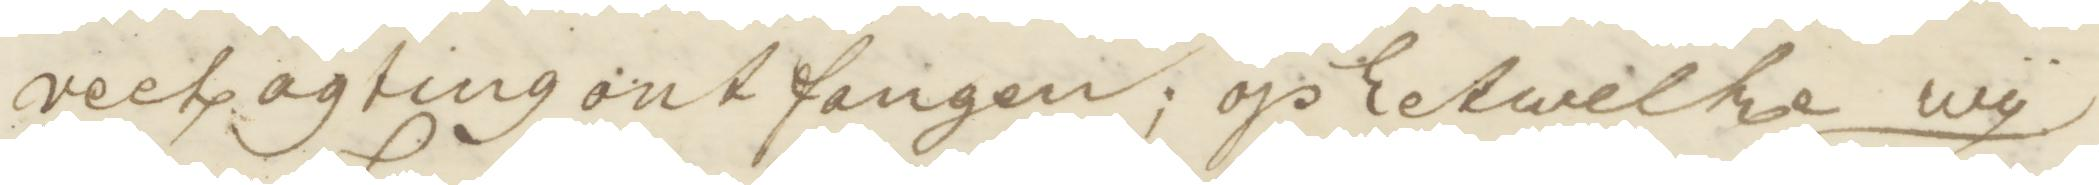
veel agting ont fangen; op hetwelke wij
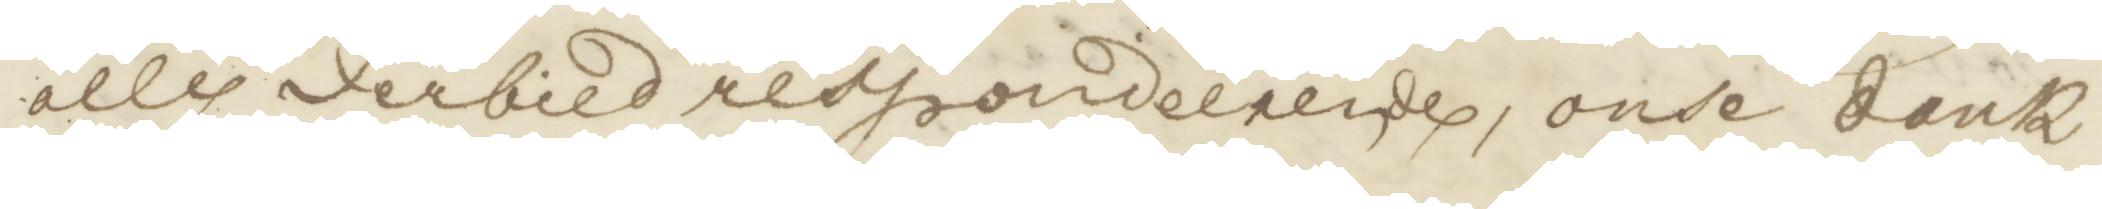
alle Eerbied respondeerende, onse dank
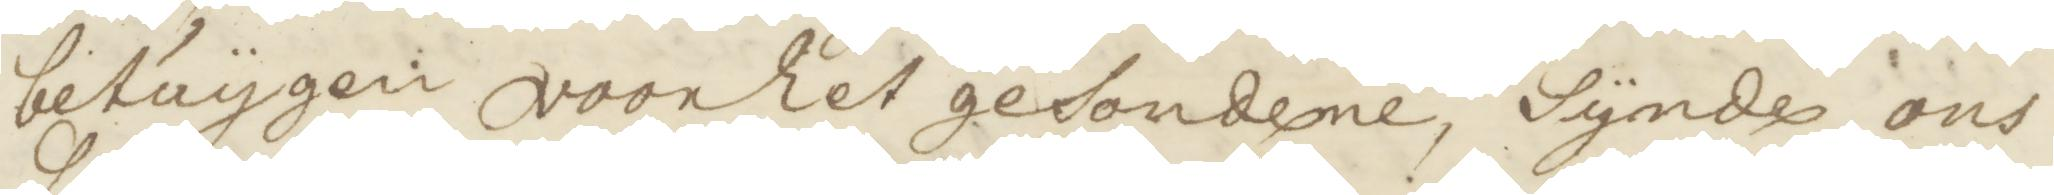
betuijgen voor het gesondene, sijnde ons
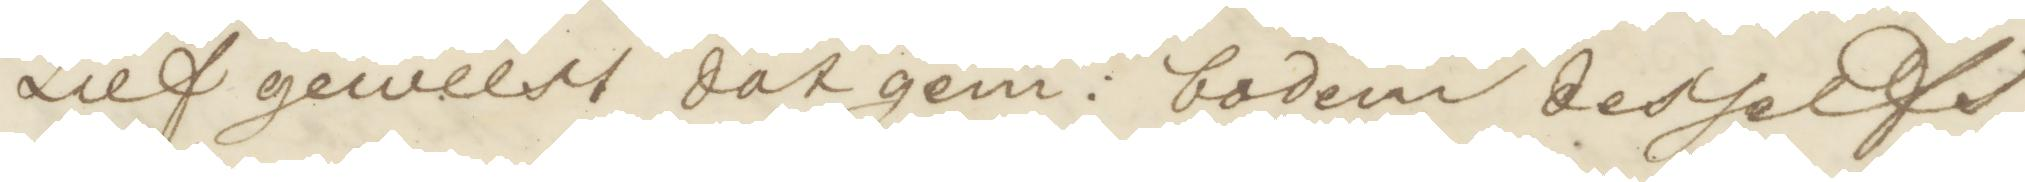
Lief geweest dat gem: bodem desselfs
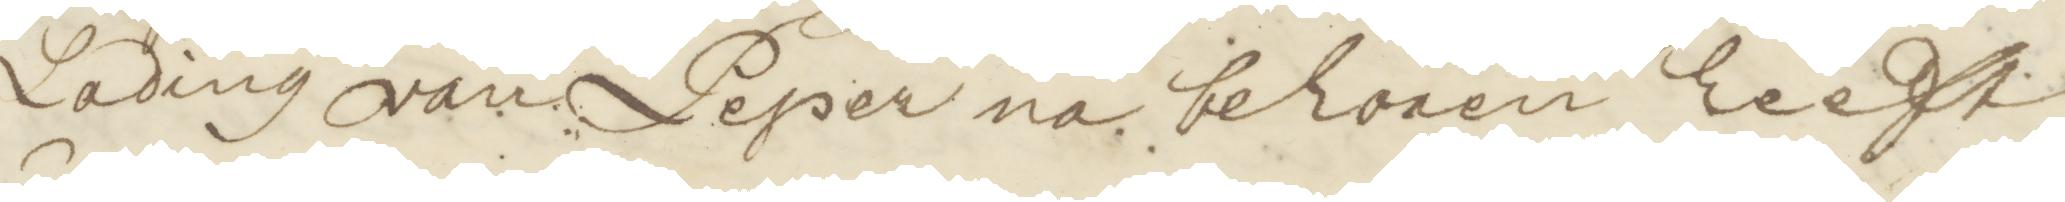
Lading van Peper na behoren heeft
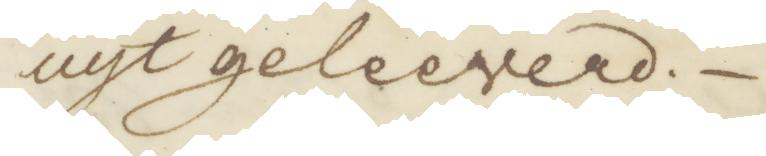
uijt geleeverd. —
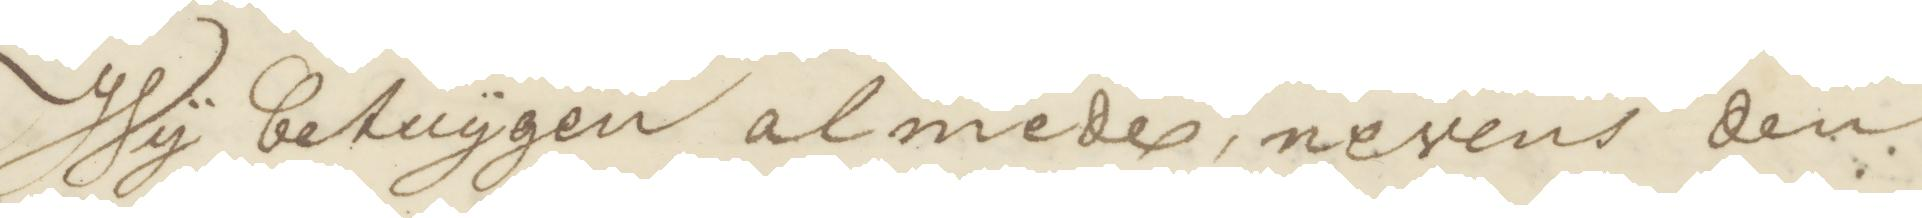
Wij betuijgen al mede, nevens den
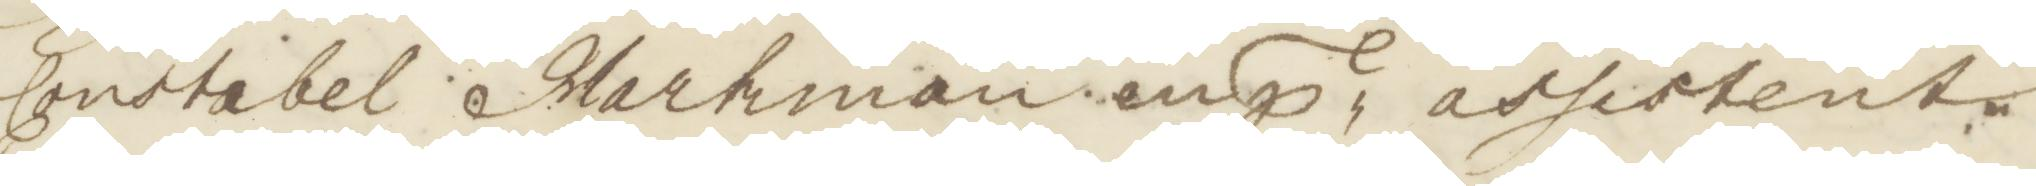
Constabel Markman en Cp„e assistent„
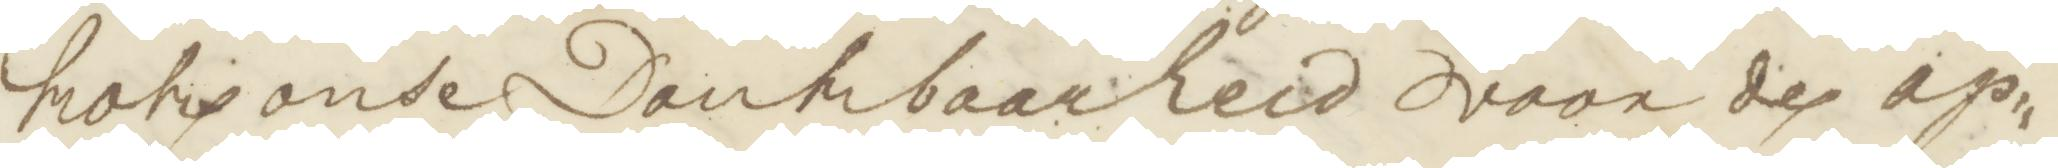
kokx onse Dankbaarheid voor de ap„
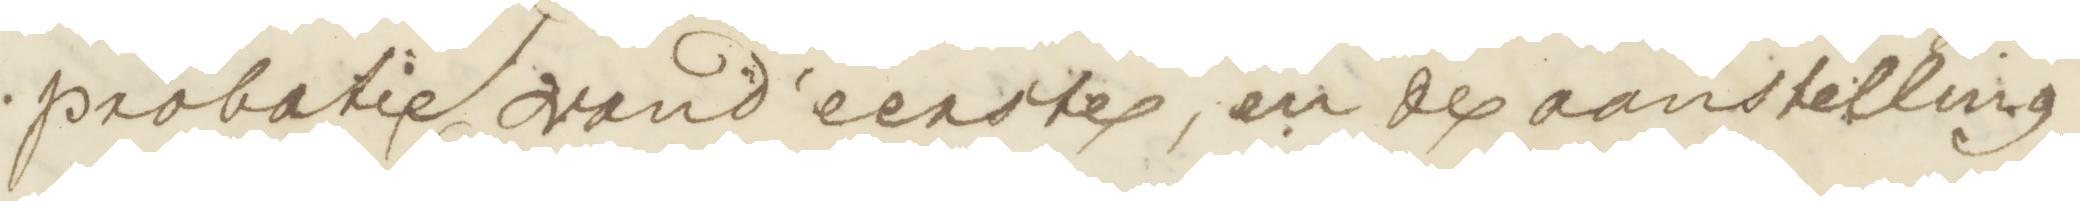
probatie vand’eerste, en de aanstelling
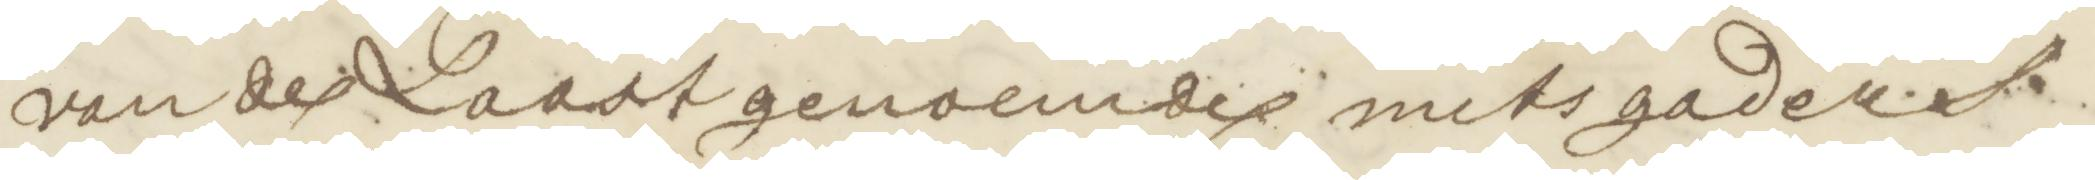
van de Laast genoemde mits gaders
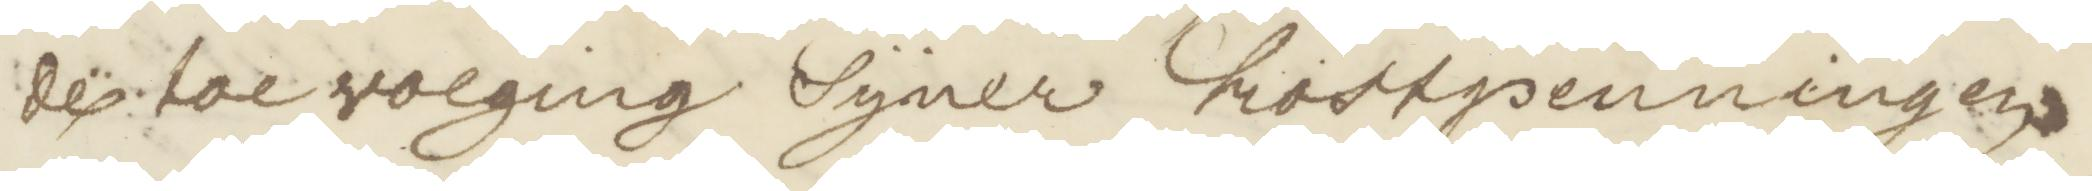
de toevoeging sijner kostpenningen
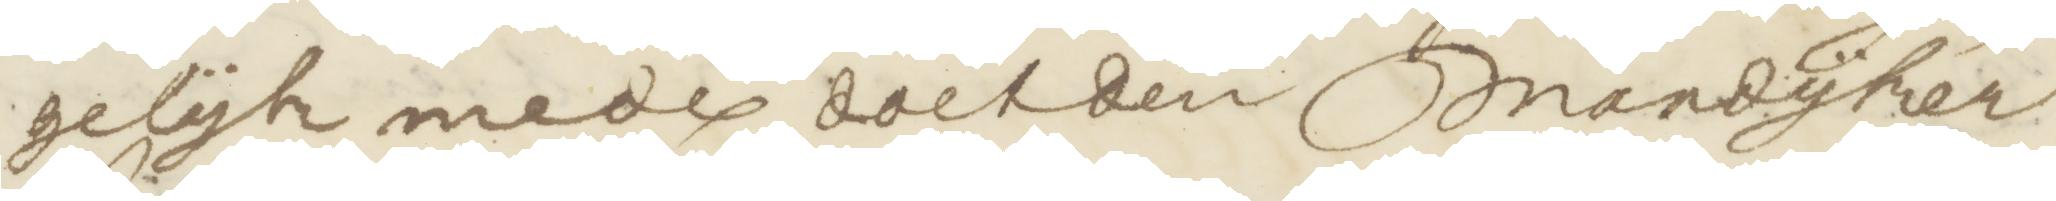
gelijk mede doet den Mandijker
